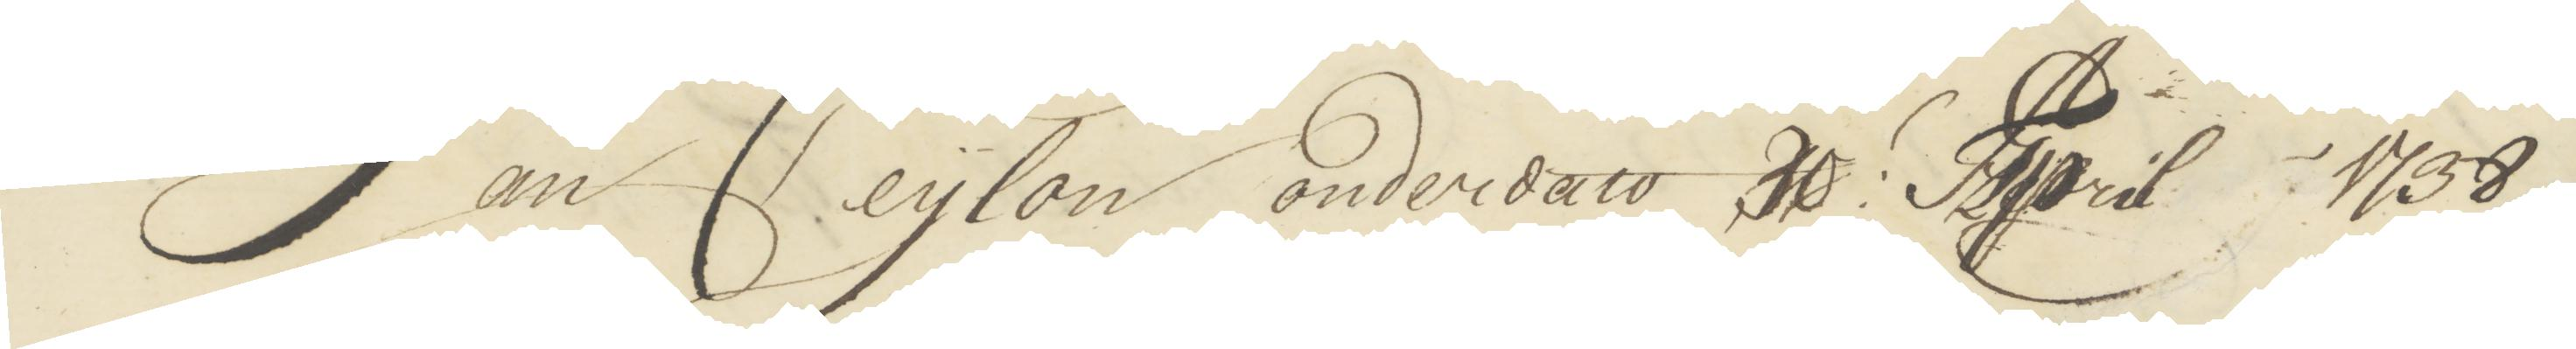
Van Ceijlon onder dato 30:' April 1738.
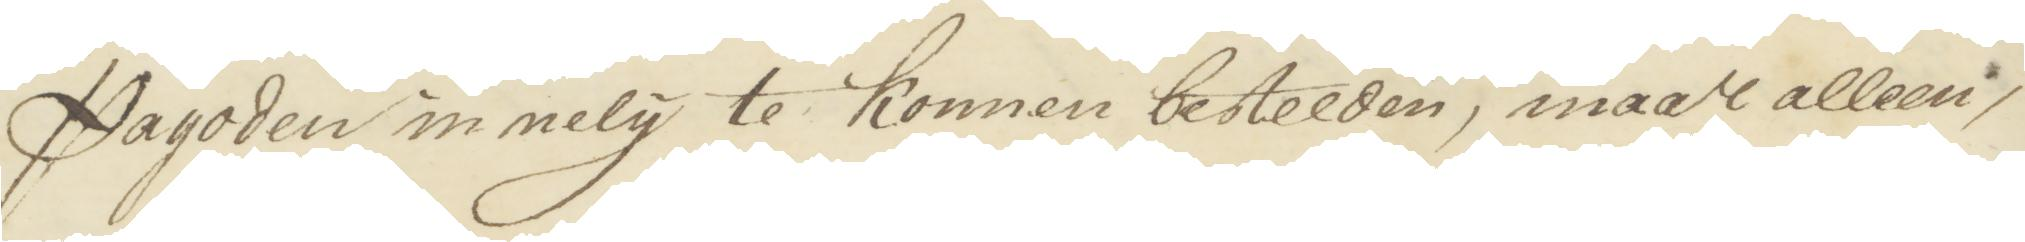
Pagoden in nelij te konnen besteeden, maar alleen,
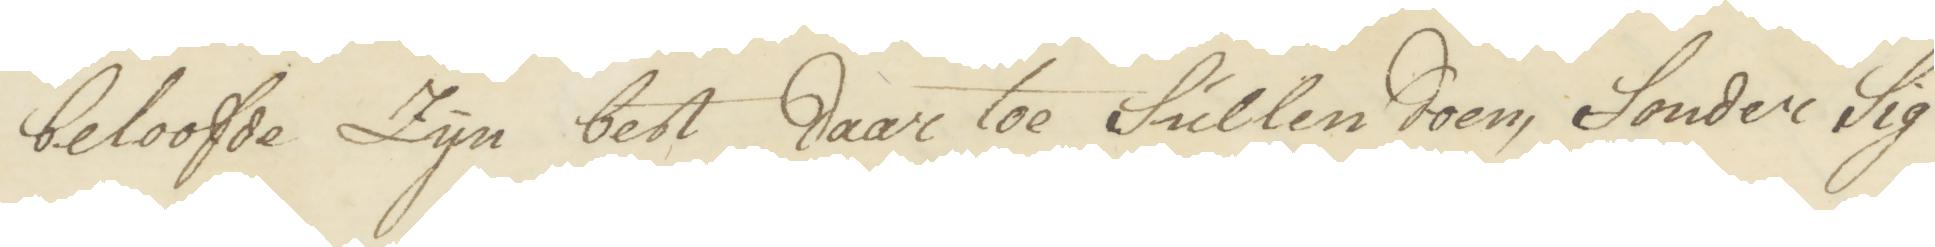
beloofde zijn best daar toe sullen doen, sonder sig
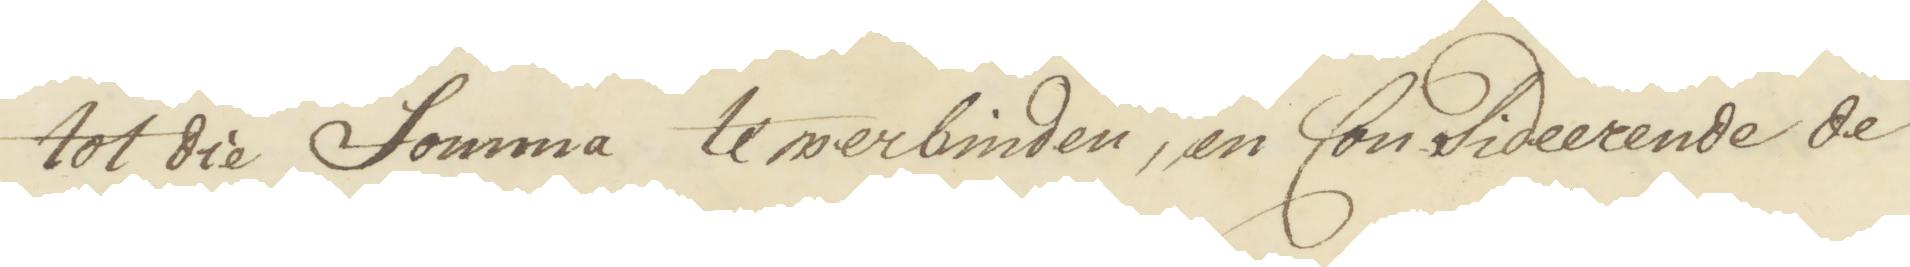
tot die somma te verbinden, en Consideerende de
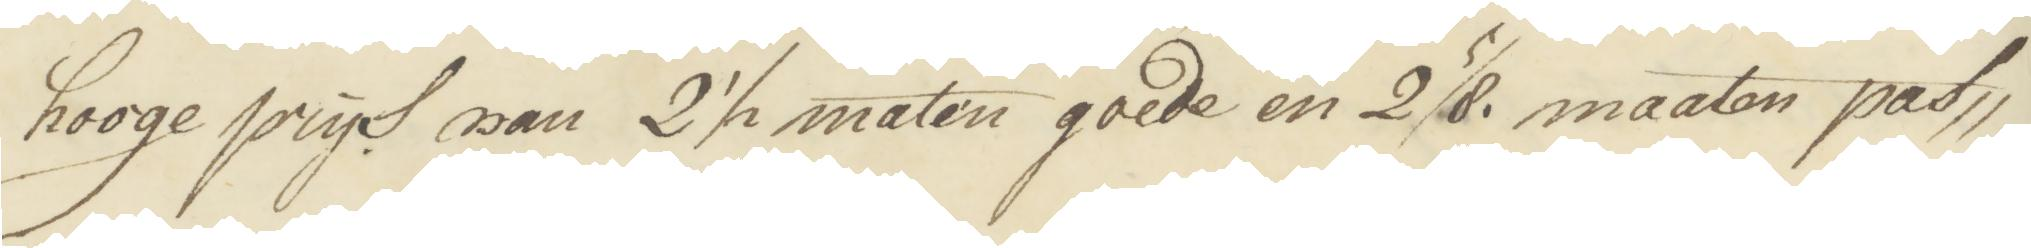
hooge prijs van 2½ maten goede en 2 5/8. maaten pas„
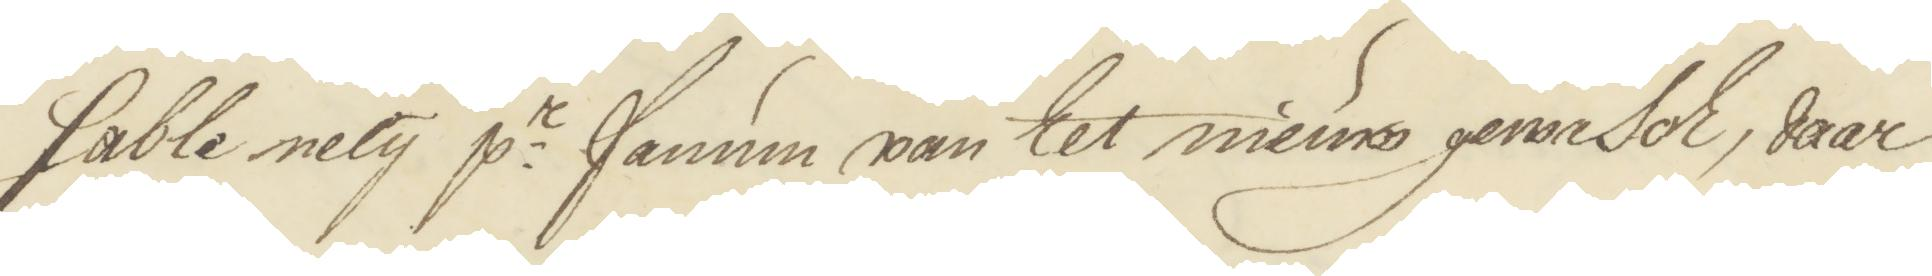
Sable nelij p=r Fanum van het nieuw gewasch, daar
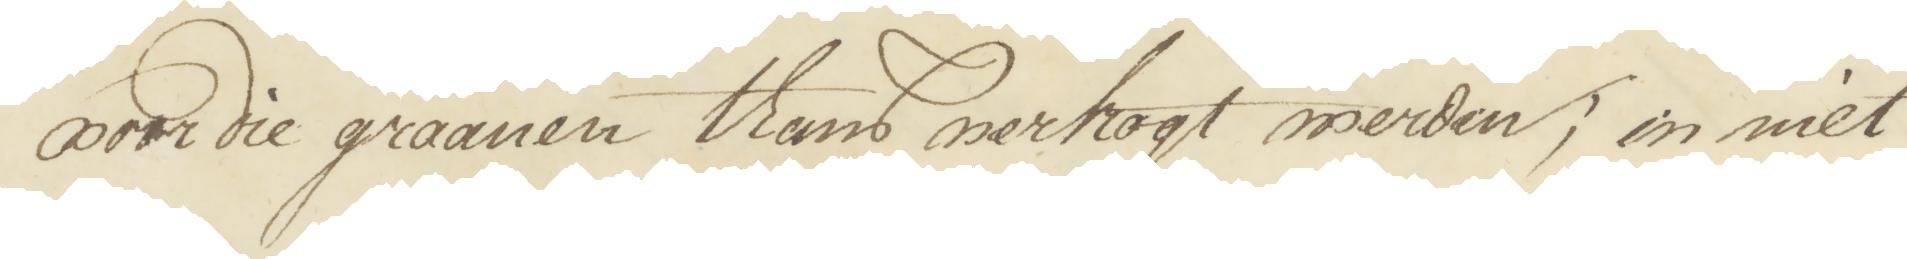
voor die graanen thans verkogt werden; en niet
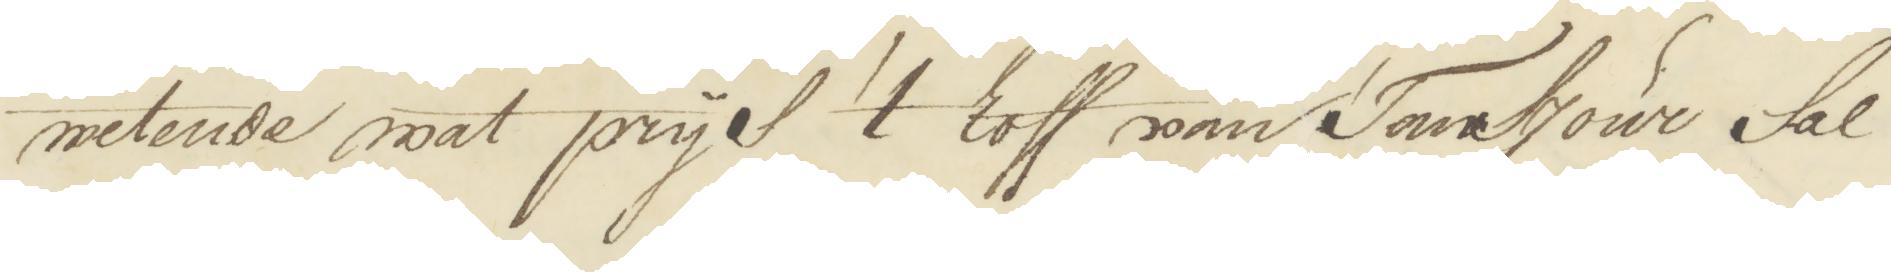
wetende wat prijs ’t hoff van Tours Jour sal
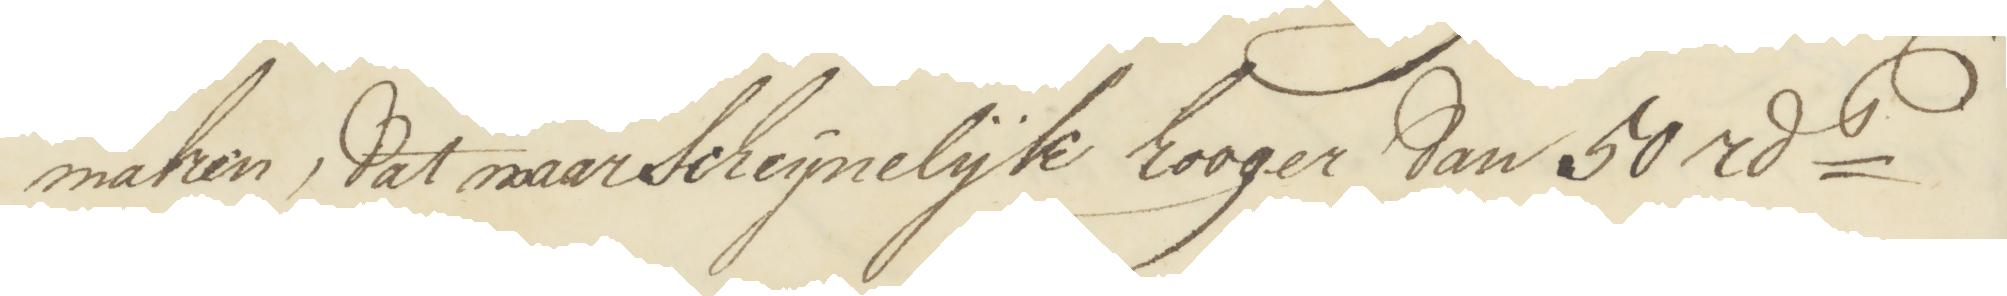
maken, dat waarscheijnelijk hooger dan 50 rd=s
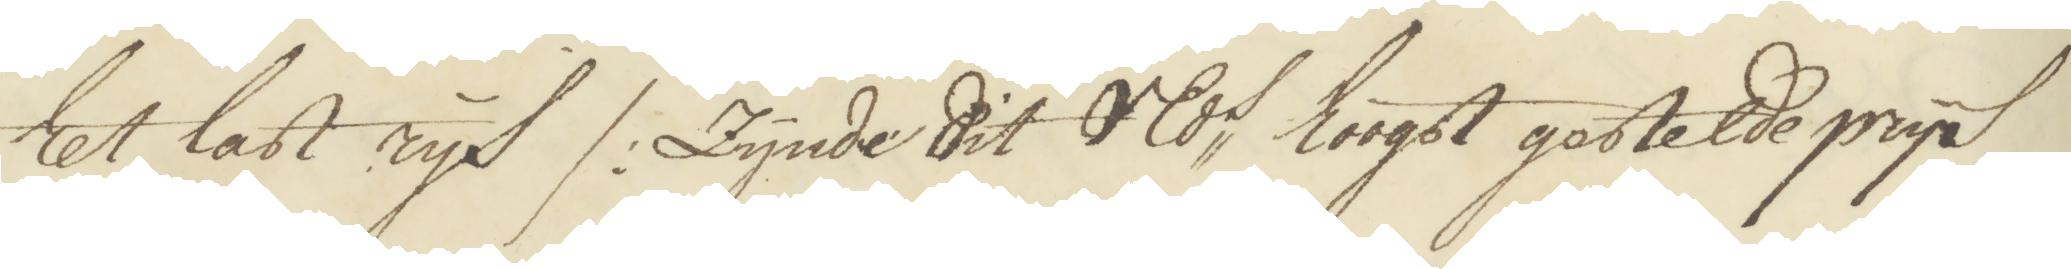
het last rijs /:zijnde dit VEd„s hoogst gestelde prijs
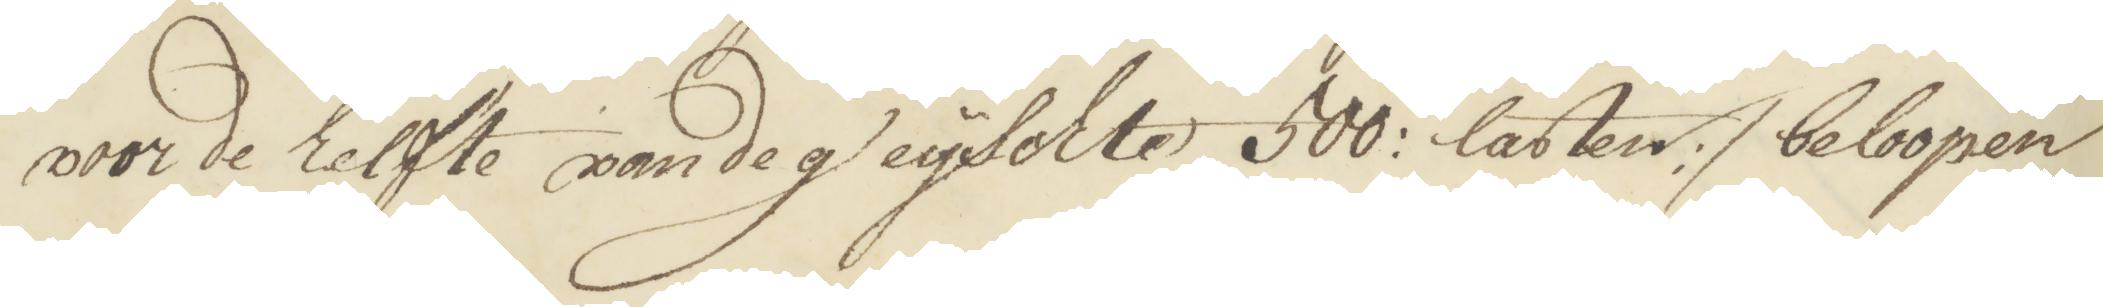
voor de helfte van de g’eijschte 500: lasten:/ beloopen
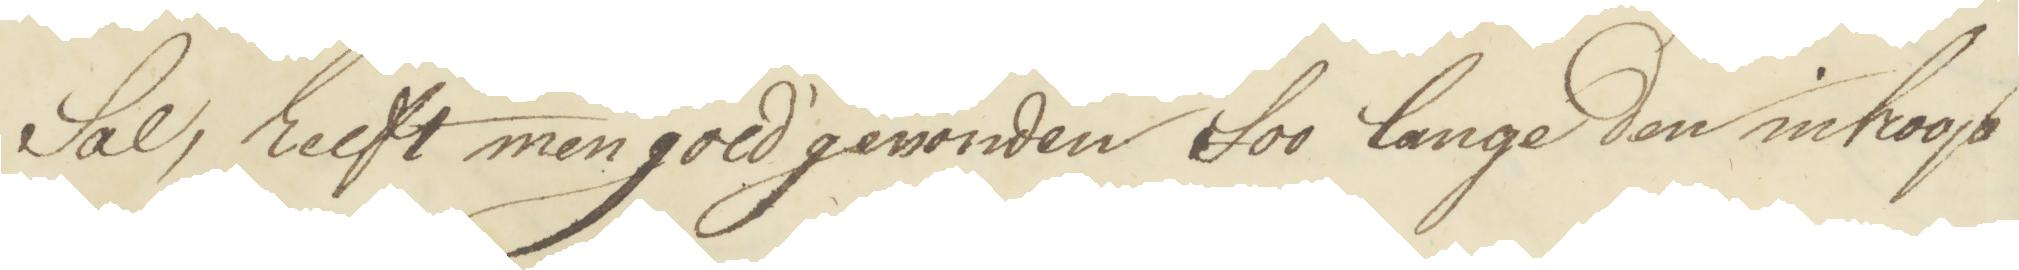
sal, heeft men goed gevonden soo lange den inkoop
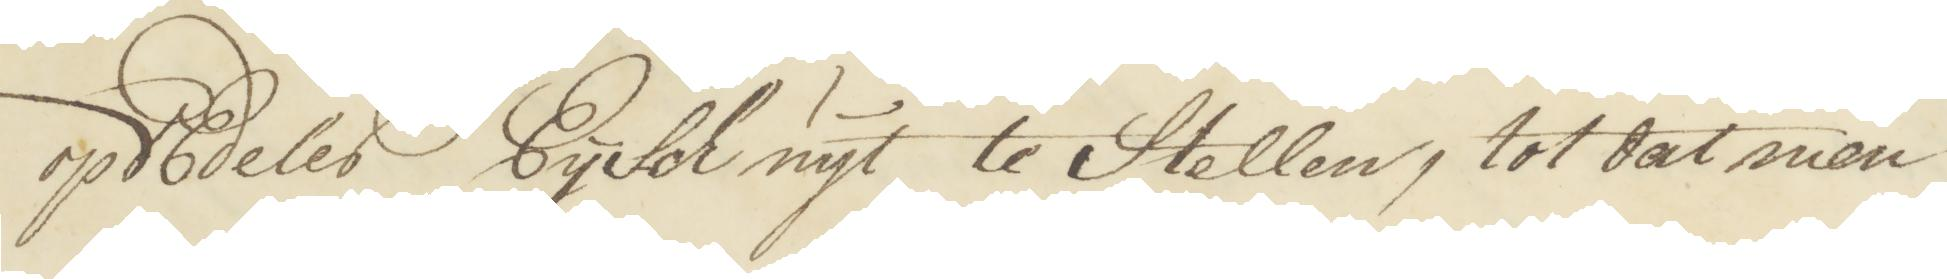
op VEdeles Eijsch uijt te stellen, tot dat men
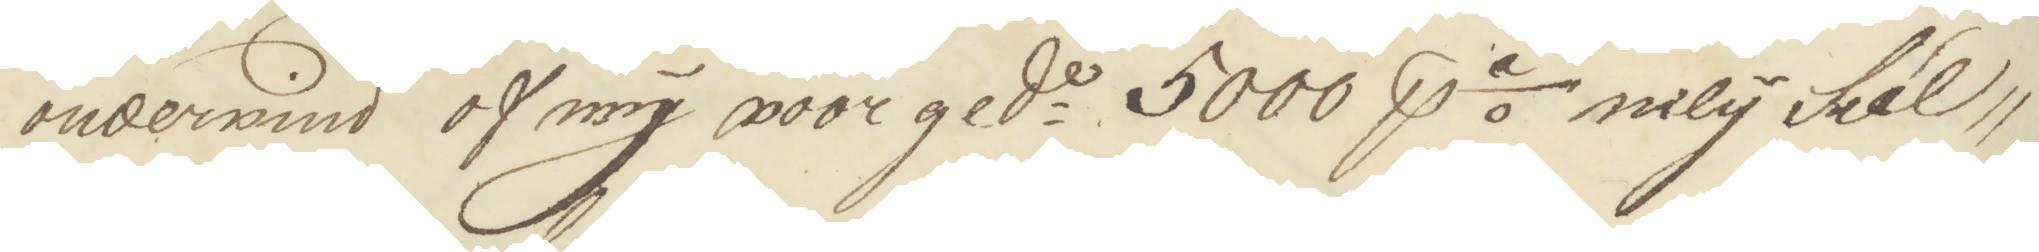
ondervind of wij voor ged=e 5000 p a/o nelij sul„
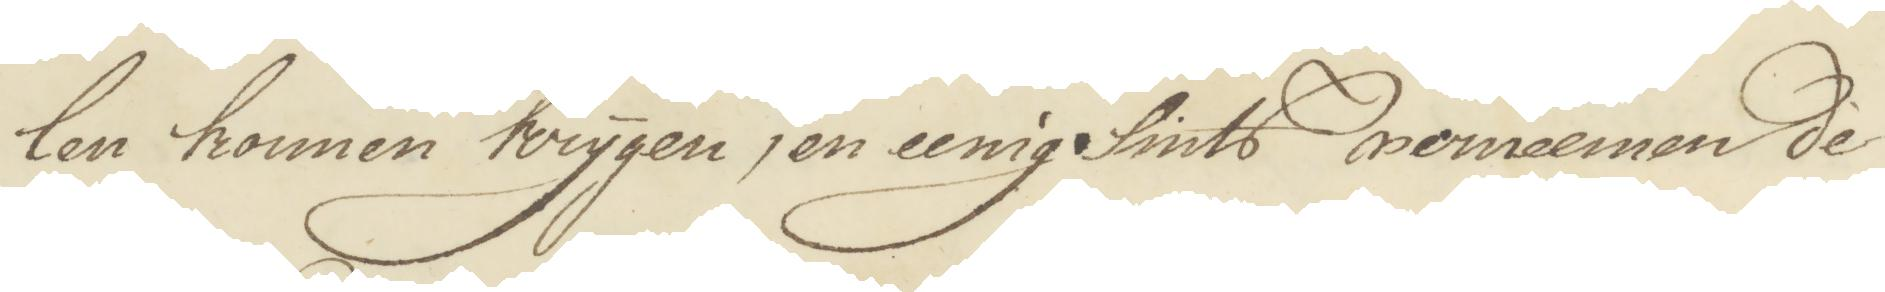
len konnen krijgen, en eenig sints verneemen de
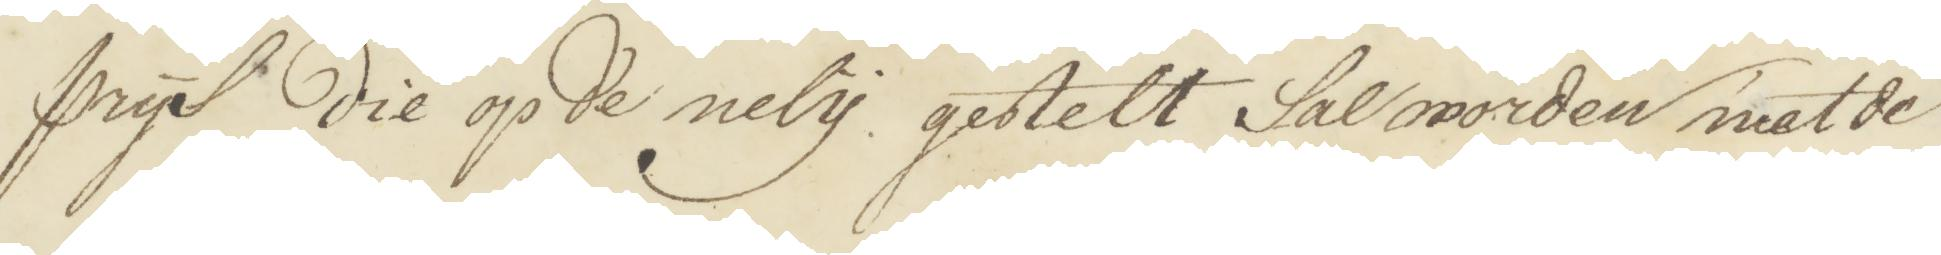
prijs die op de nelij gestelt sal worden met de
